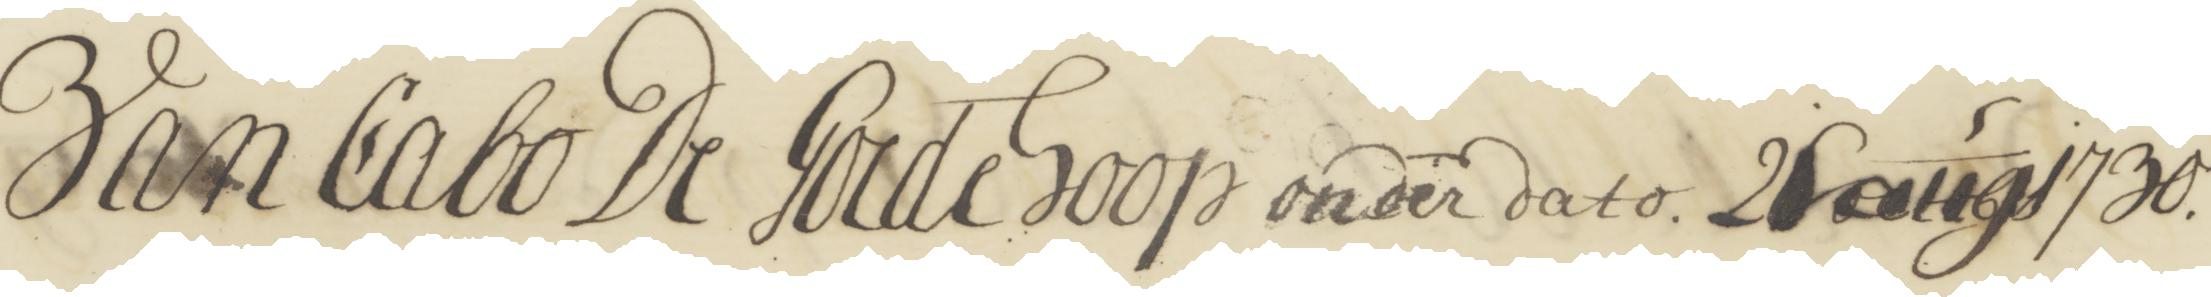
Van Cabo De Goede Hoop onder dato 21 augs 1730.
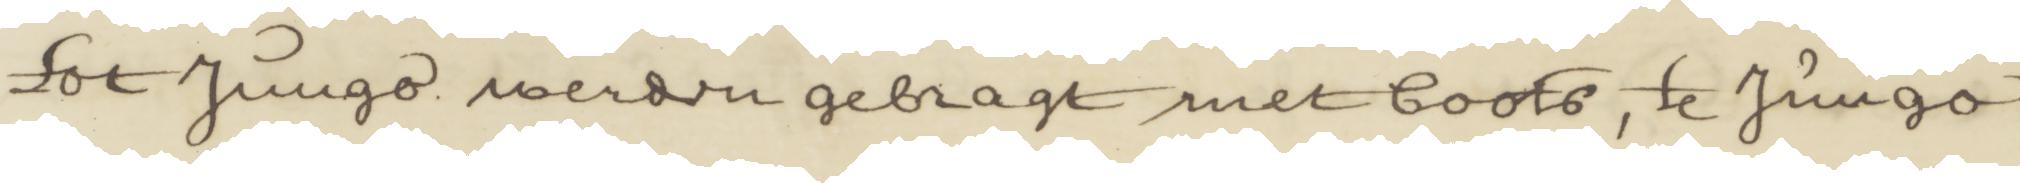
tot Jungo werden gebragt met boots, te Jungo
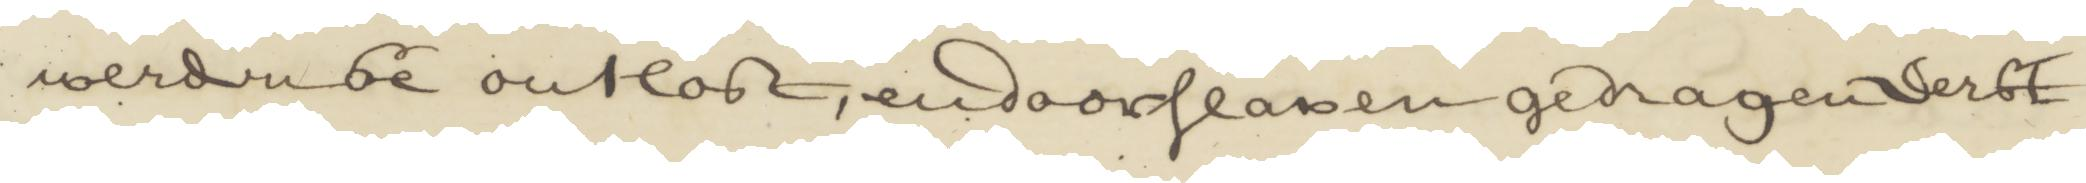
werden se ontlost, en door slaven gedragen Eerst
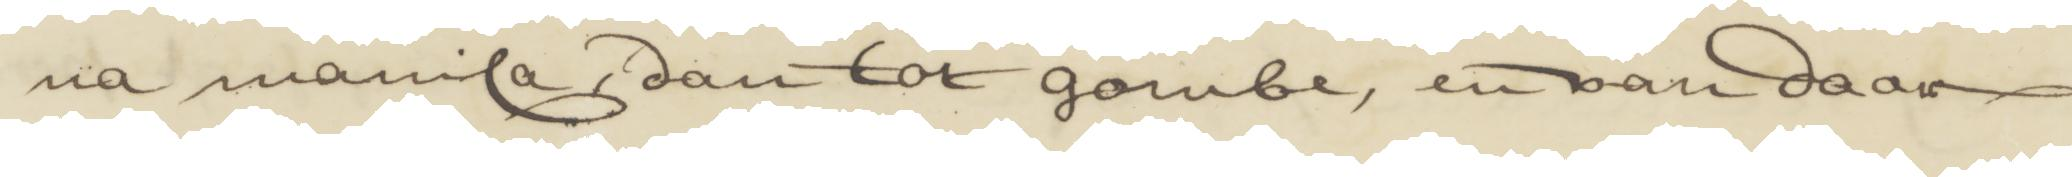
na manica, dan tot gombe, en van daar
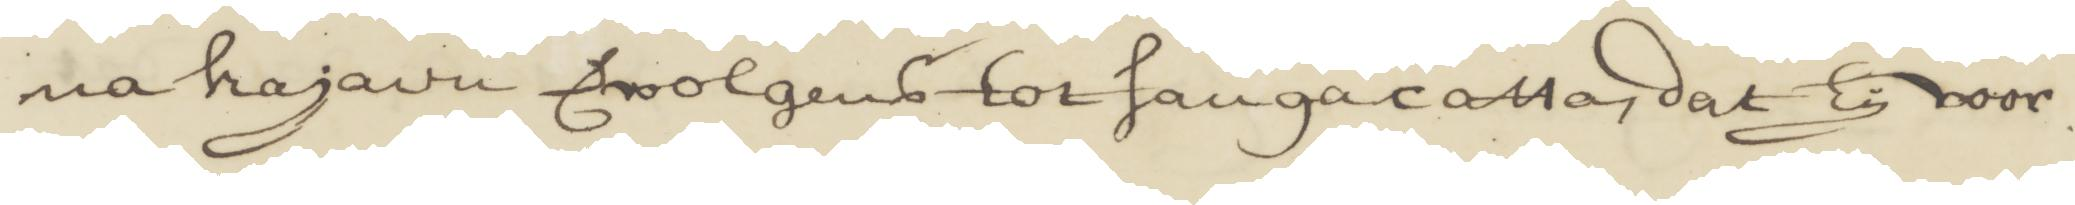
na kajaen vervolgens tot sangacatta, dat hij voor
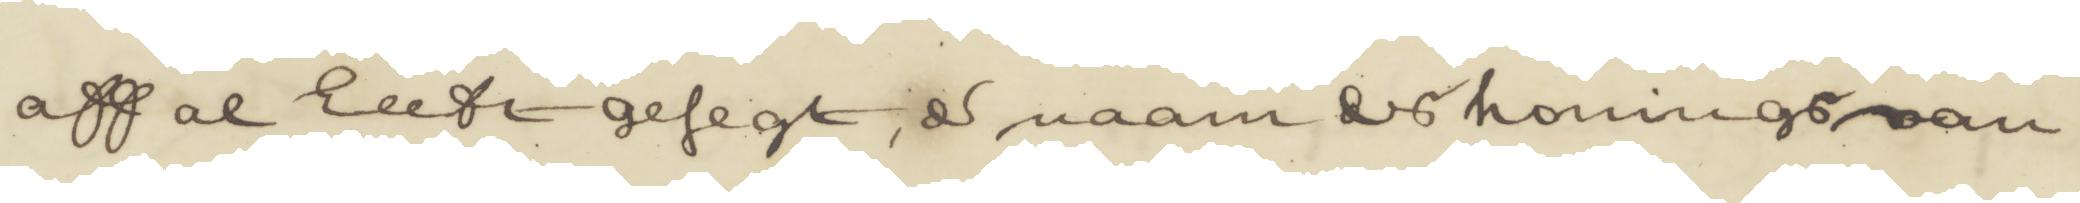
aff al heeft gesegt, de naam des konings van
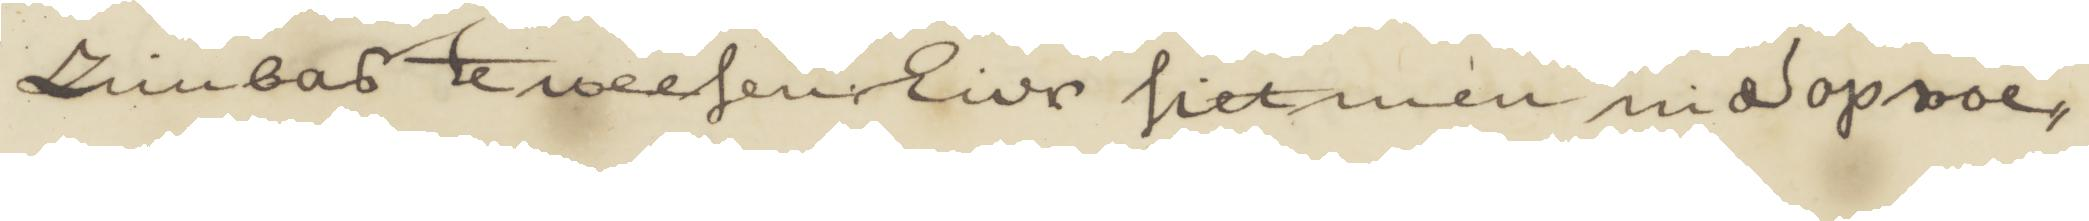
zunbas te weesen, hier siet men inde op voe„
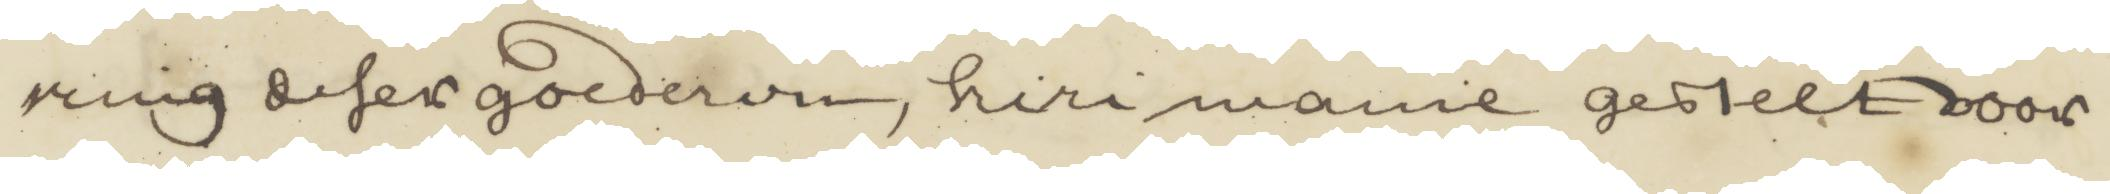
ring deser goederen, kiri manie gestelt voor
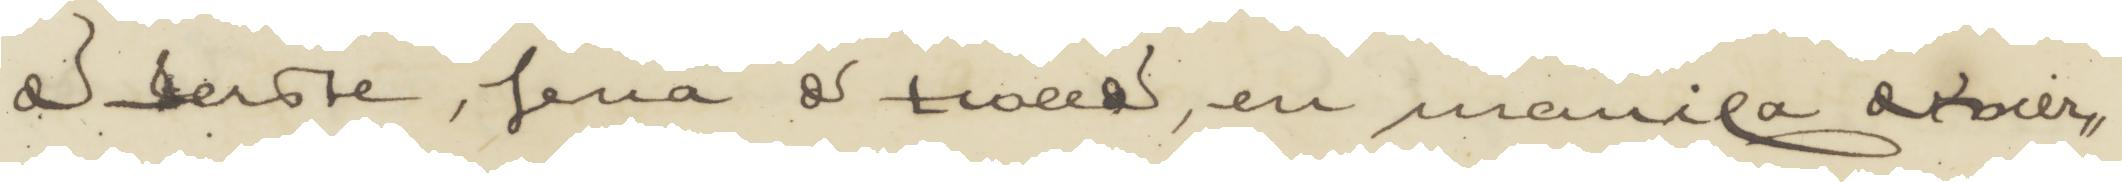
de eerste, sena de tweede, en manica de vier„
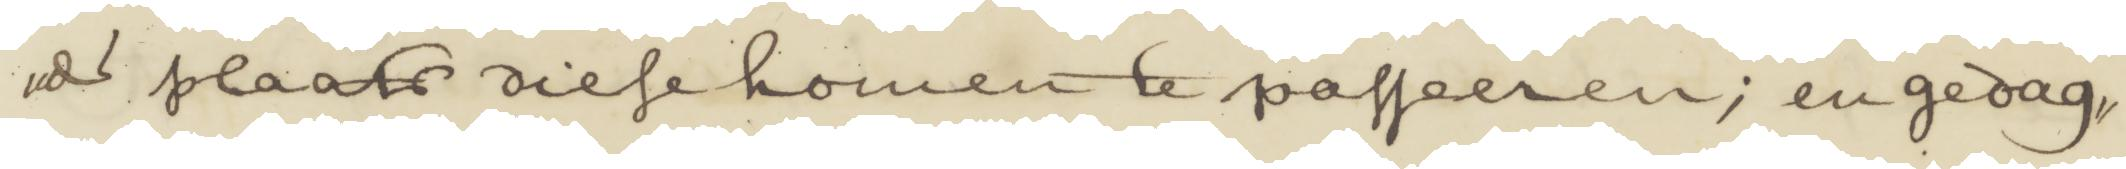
de plaats diese komen te passeeren; en gedag„
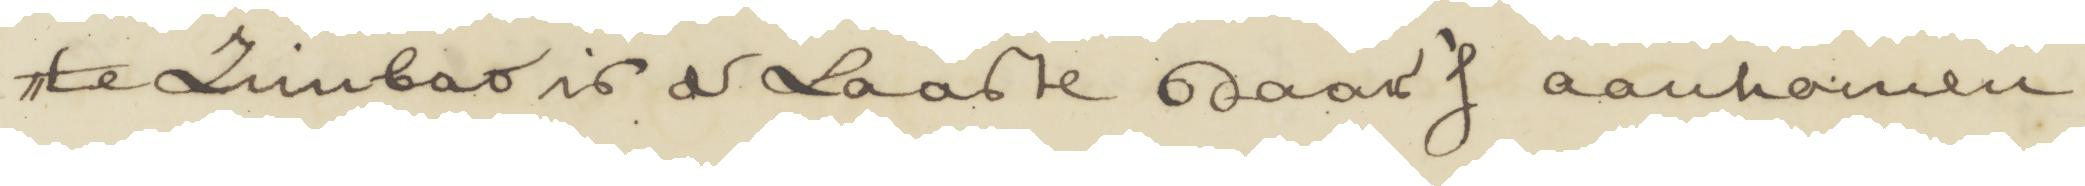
„te zimbas is de laaste daar 's aankomen
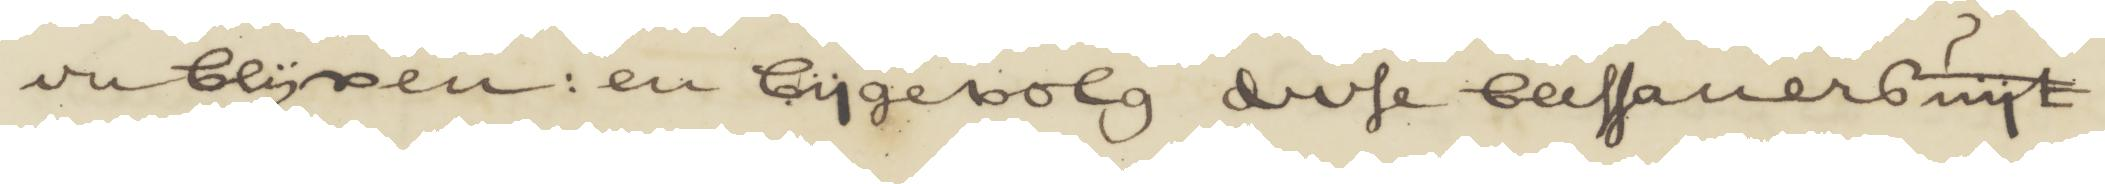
en blijven: en bijgevolg deese beessaners uijt
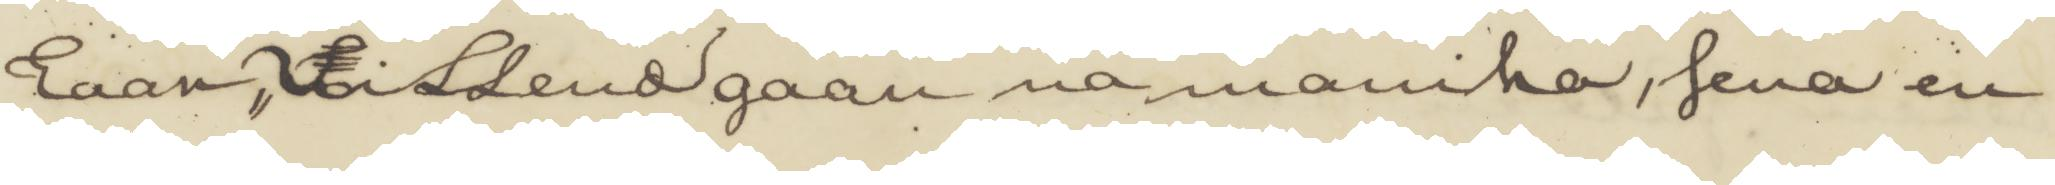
haar„ wissende gaan na manika, sena en
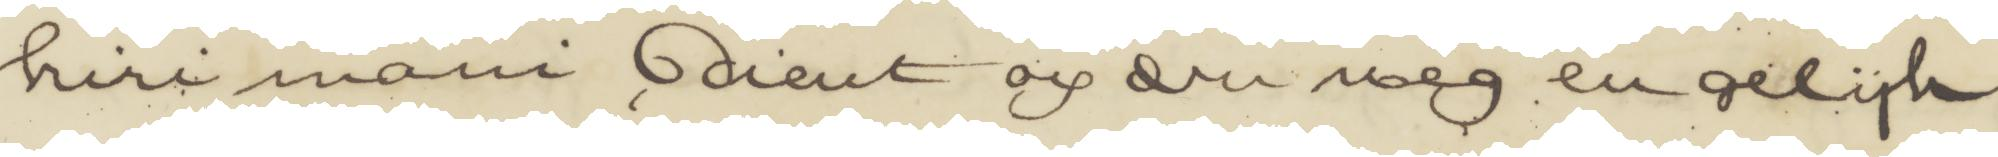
hiri mani, dient op den weg en gelijk
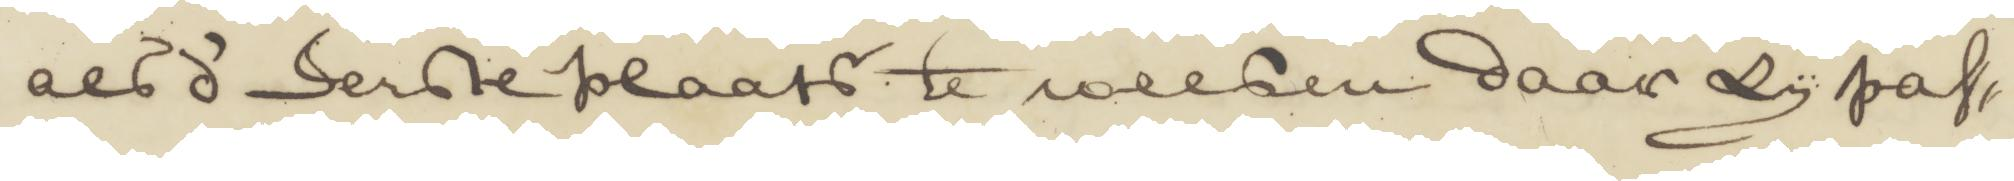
als d’ Eerste plaats te weesen daar zij pas„
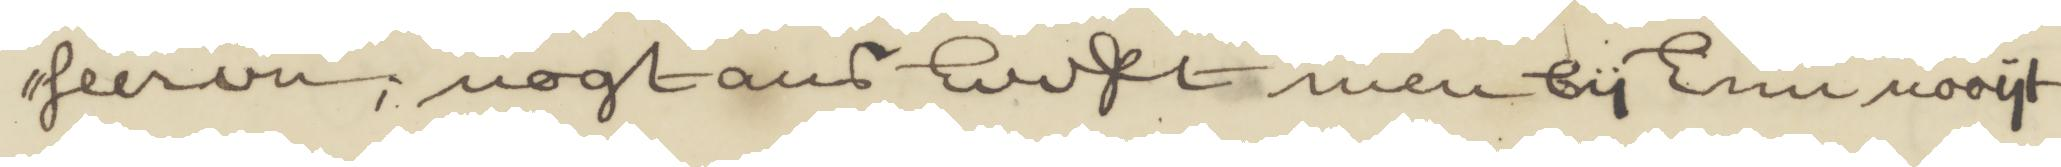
„seeren; nogtans heeft men bij hun nooijt
